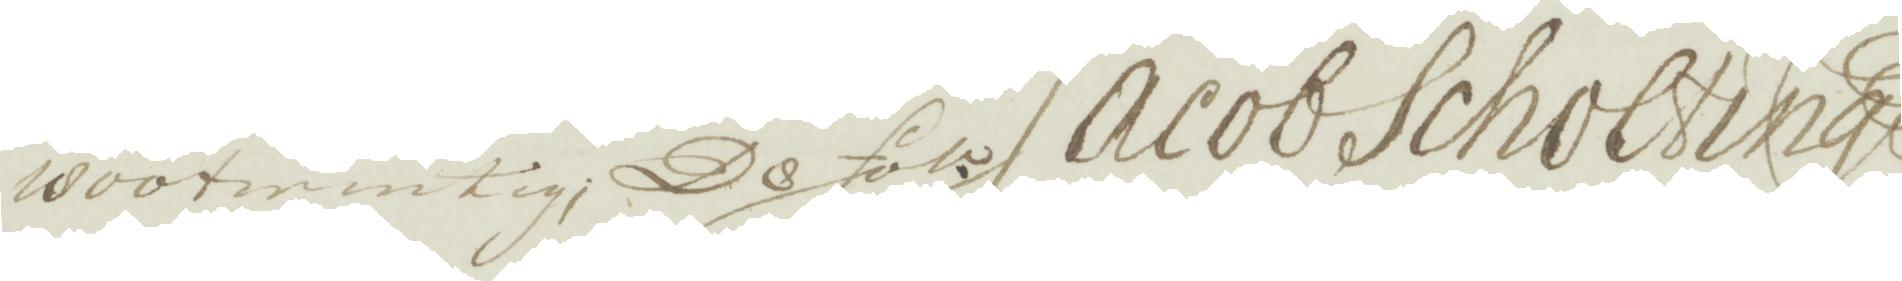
1800twintig; D8 Fol.o Jacob Scholting
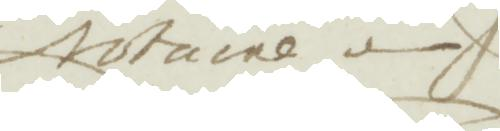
notaire
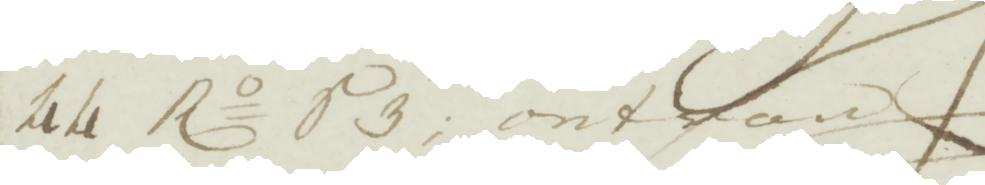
44 R=o V3; ontvan
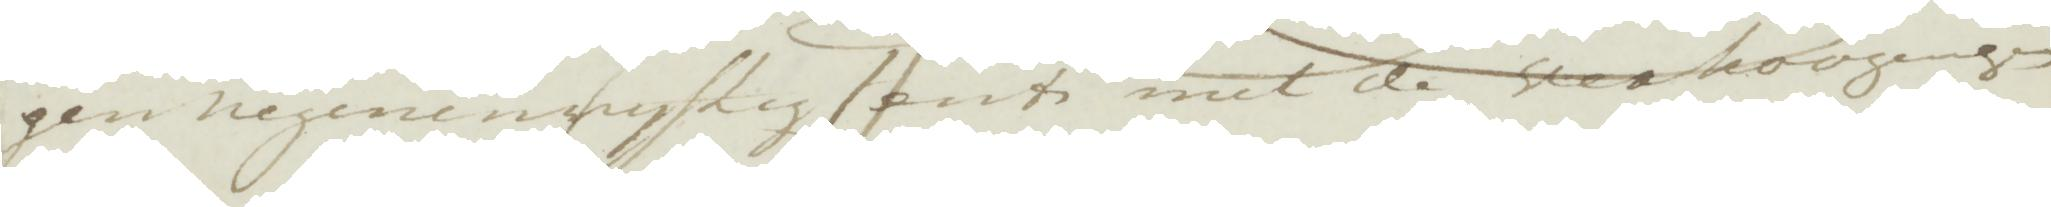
gen negenenvyftig Cents met de verhoogingen
